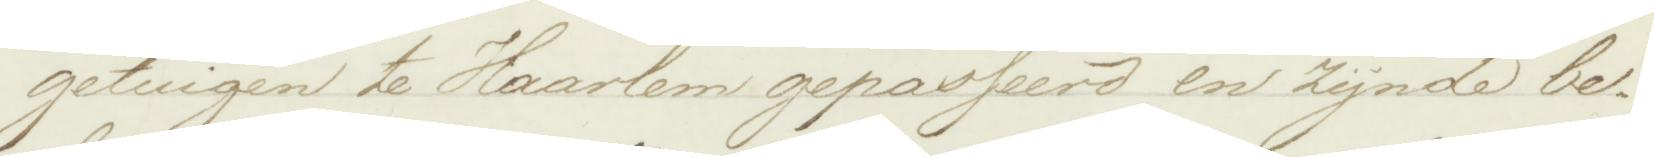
getuigen te Haarlem gepasseerd en zijnde be„
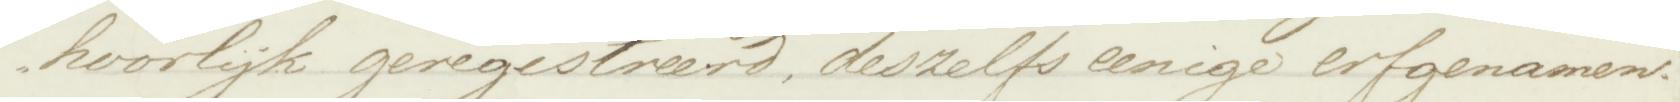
„hoorlijk geregistreerd, deszelfs eenige erfgenamen.
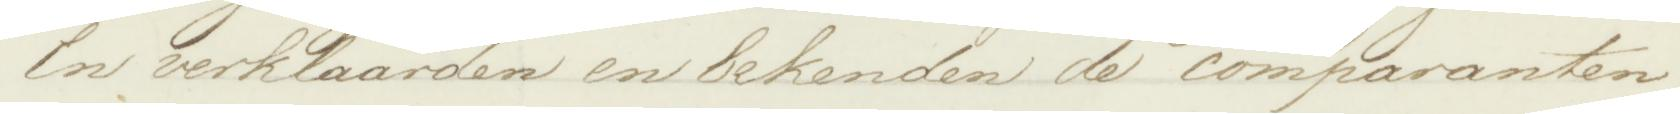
En verklaarden en bekenden de comparanten
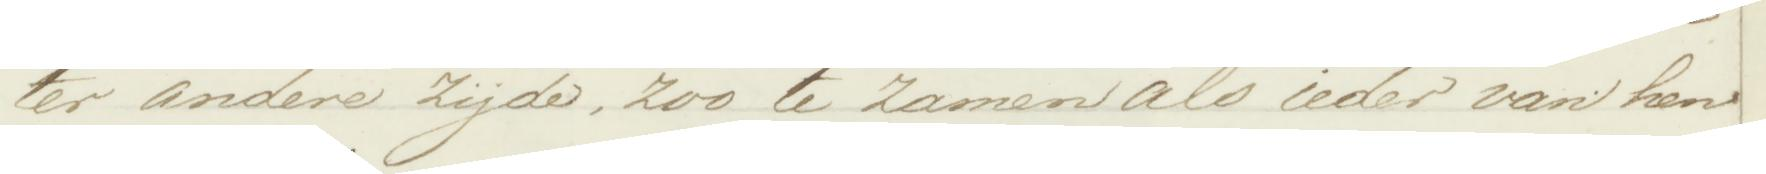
ter andere zijde, zoo te zamen als ieder van hen
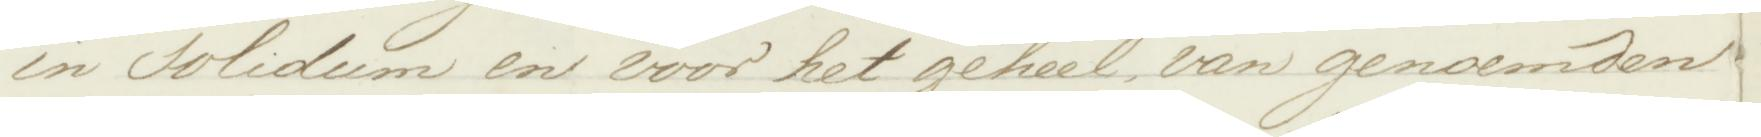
in solidum en voor het geheel, van genoemden
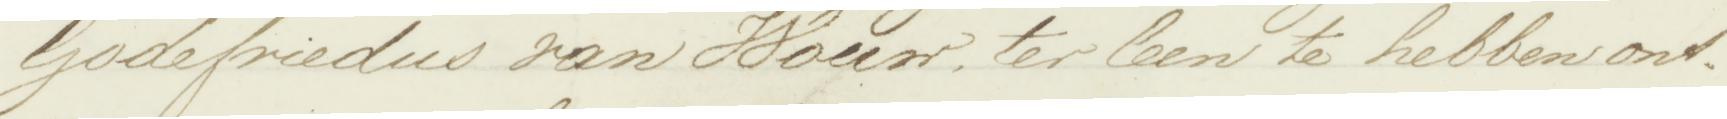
Godefriedus van Wouw, ter leen te hebben ont„
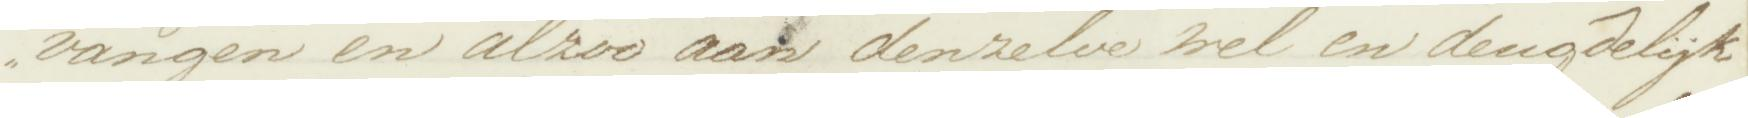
„vangen en alzoo aan denzelve wel en deugdelijk
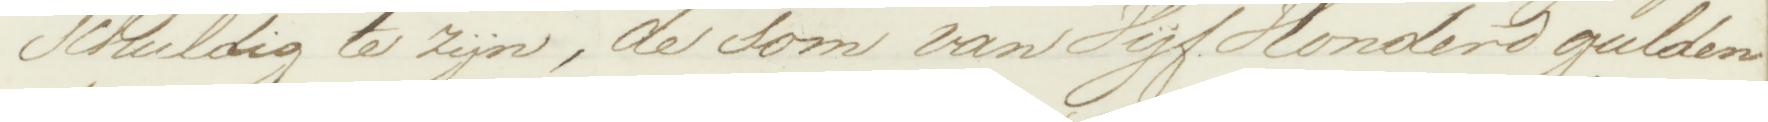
schuldig te zijn, de som van Vijf Honderd gulden
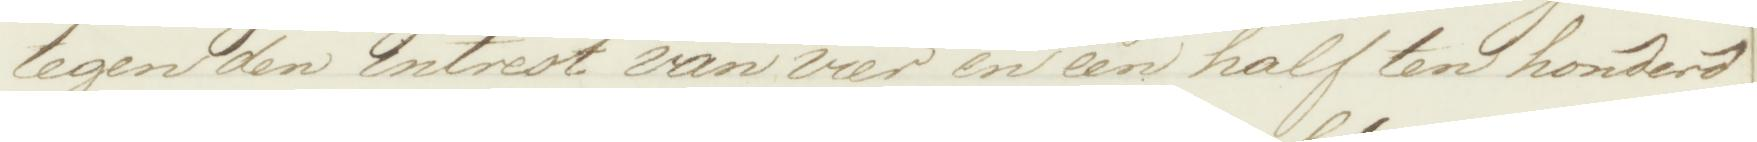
tegen den intrest van vier en een half ten honderd
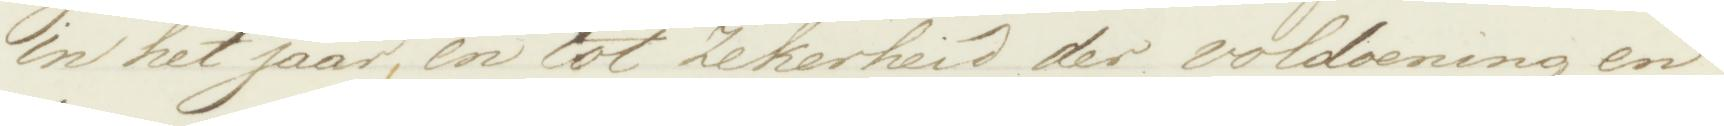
in het jaar, en tot zekerheid der voldoening en
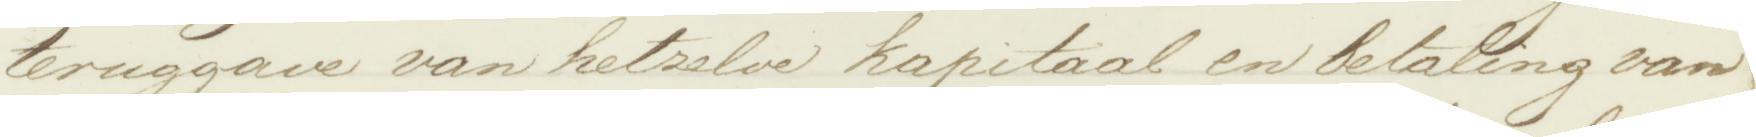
teruggave van hetzelve kapitaal en betaling van
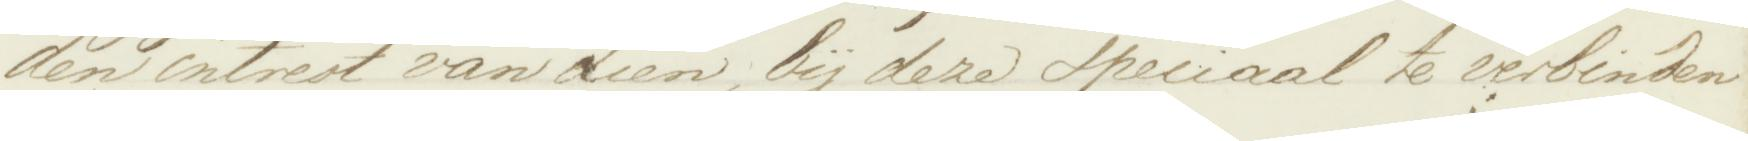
den intrest van dien, bij deze speciaal te verbinden
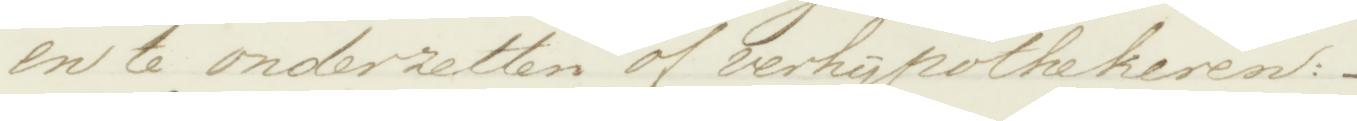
en te onderzetten of verhijpothekeren:-
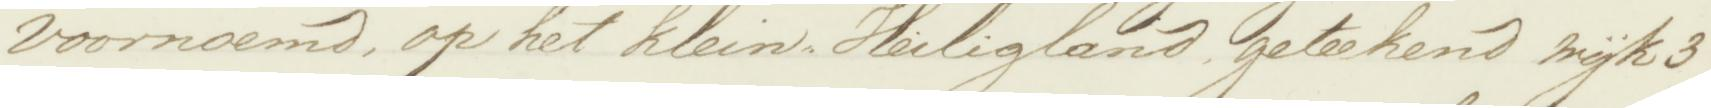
voornoemd, op het Klein, Heiligland geteekend wijk 3
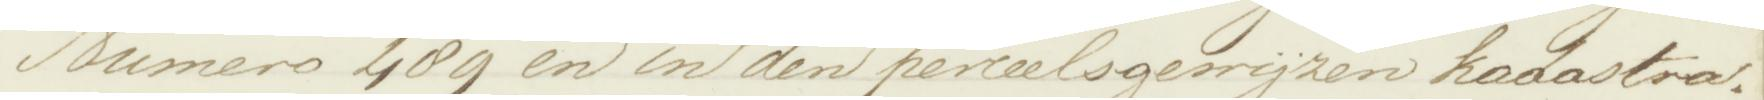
Numero 489 en in den perceelsgewijzen kadastra„
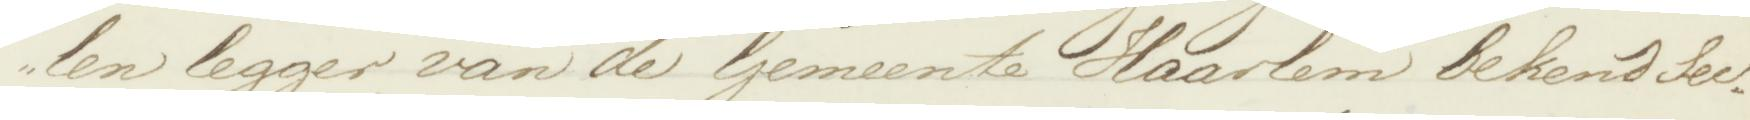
„len legger van de Gemeente Haarlem bekend Sec„
